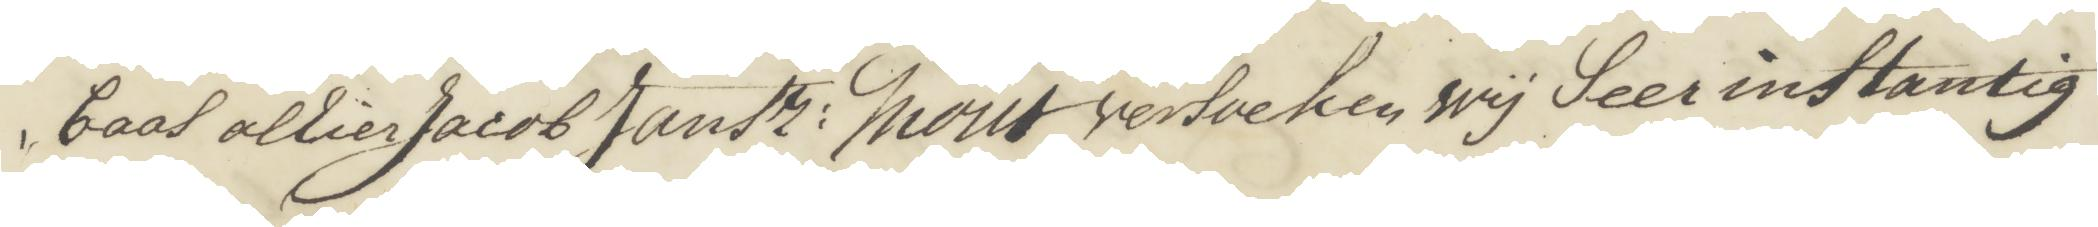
„baas alhier Jacob Jansz: mout versoeken wij seer instantig
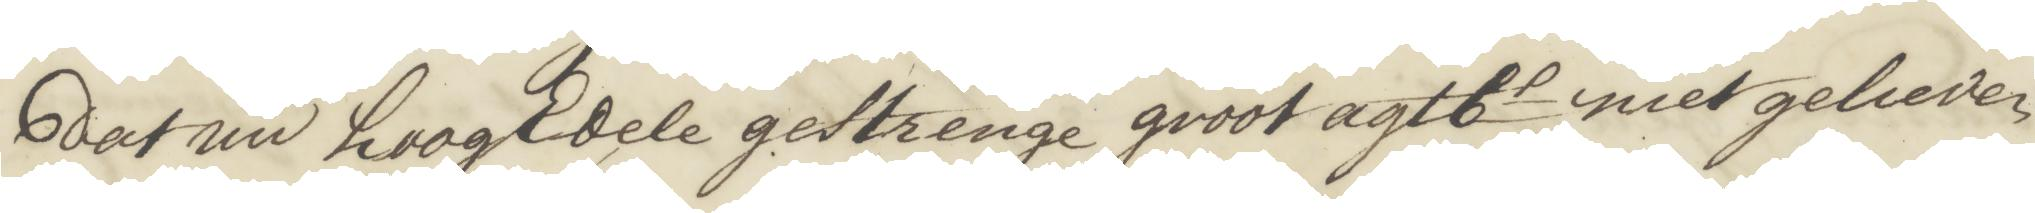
dat uw hoog Edele gestrenge groot agtb=s niet gelieven
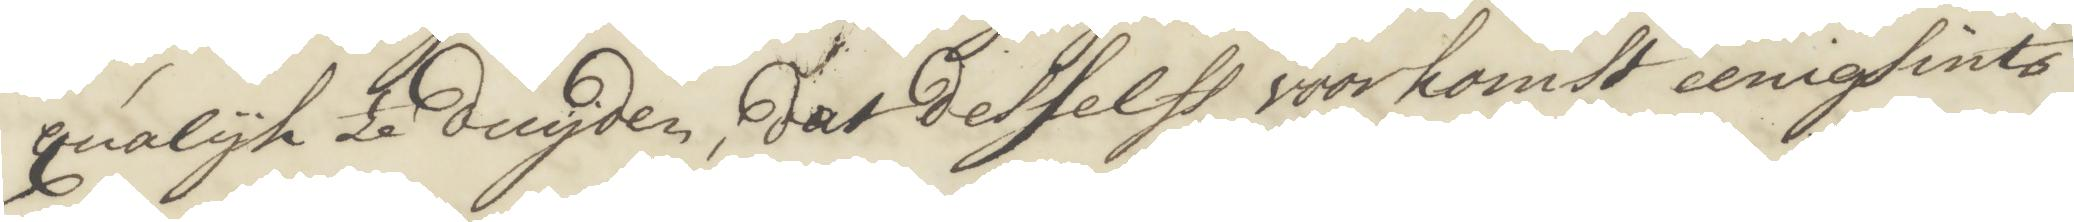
qualijk te duijden, dat desselfs voorkomst eenigsints
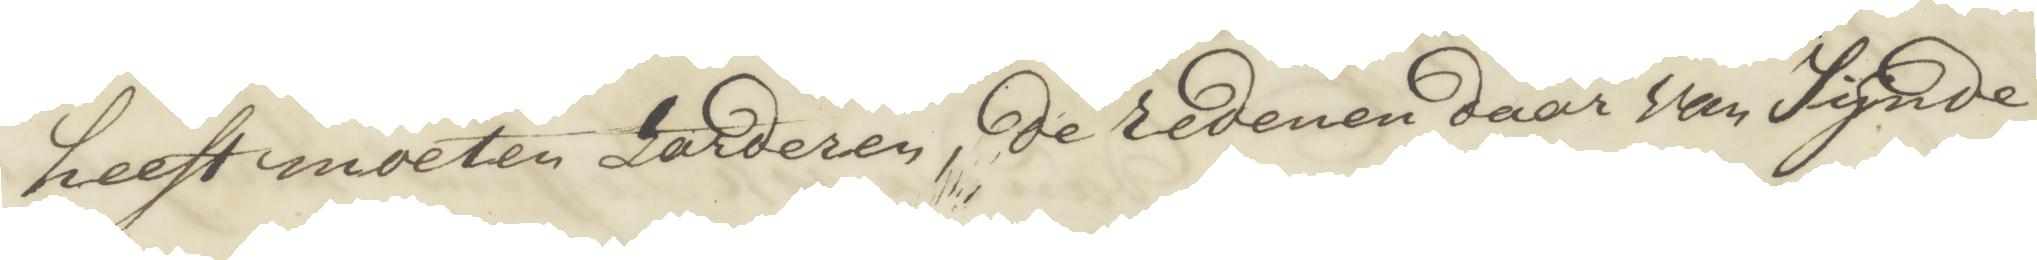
heeft moeten tarderen, de redenen daar van sijnde
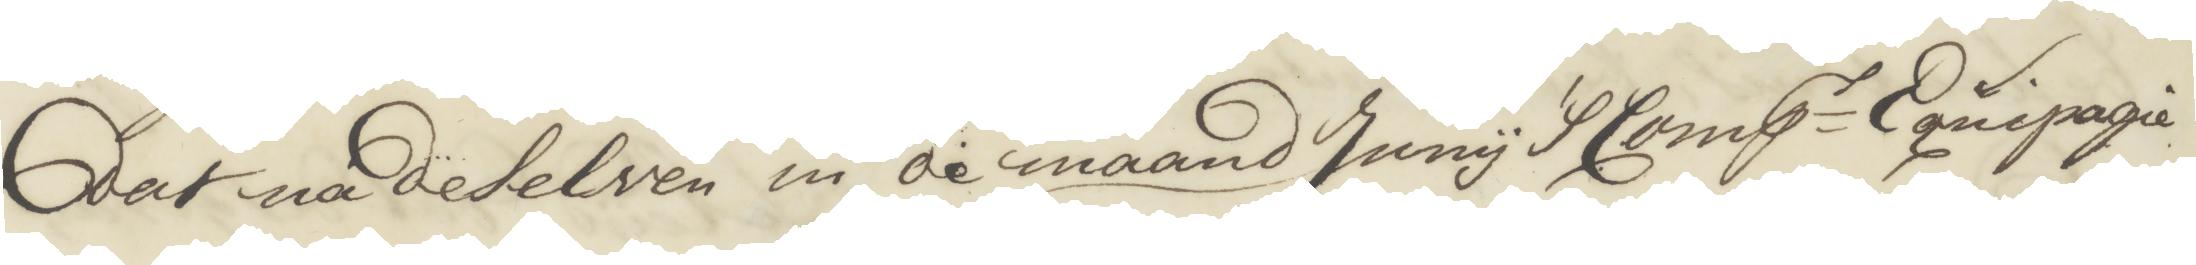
dat na deselven in de maand Junij ’s Comp=s Equipagie
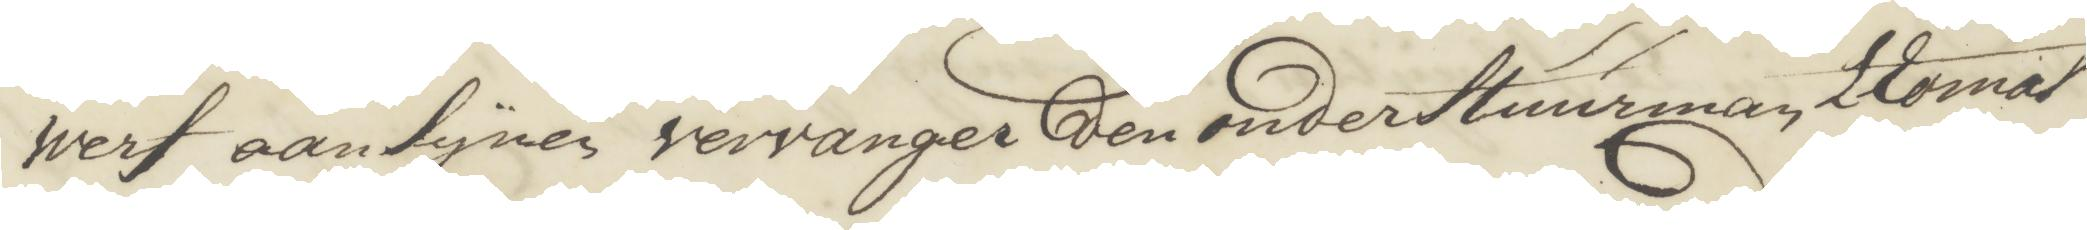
werf aan sijnen vervanger den onderstuurman thomas
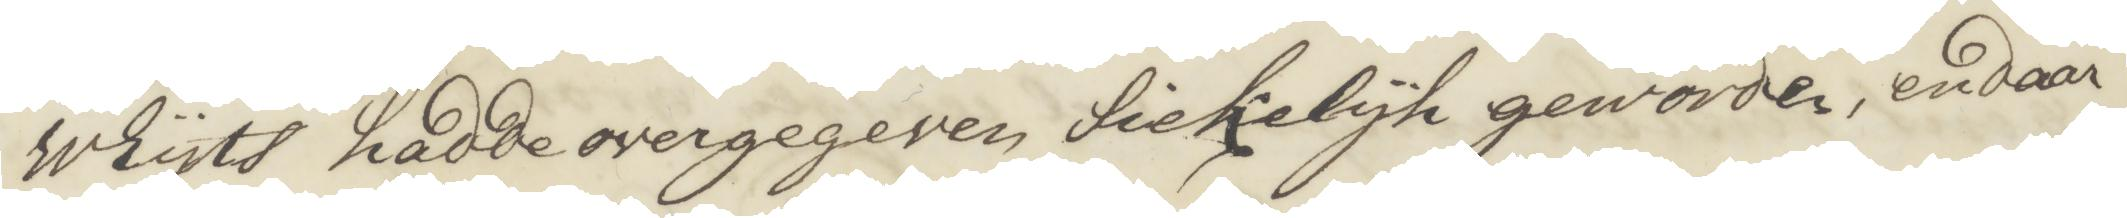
whijts hadde overgegeven siekelijk geworden, en daar
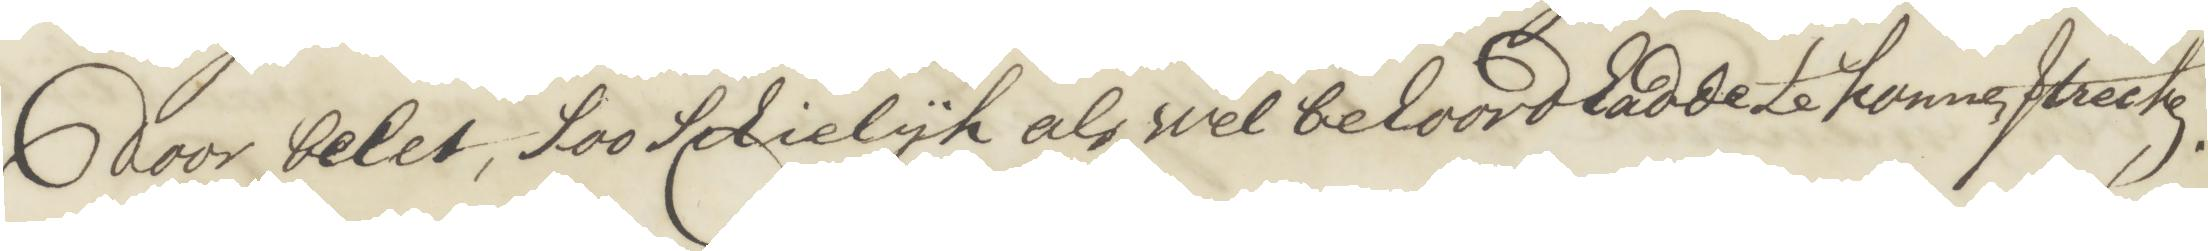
door belet, soo schielijk als wel behoord hadde te konnen vertrecken.
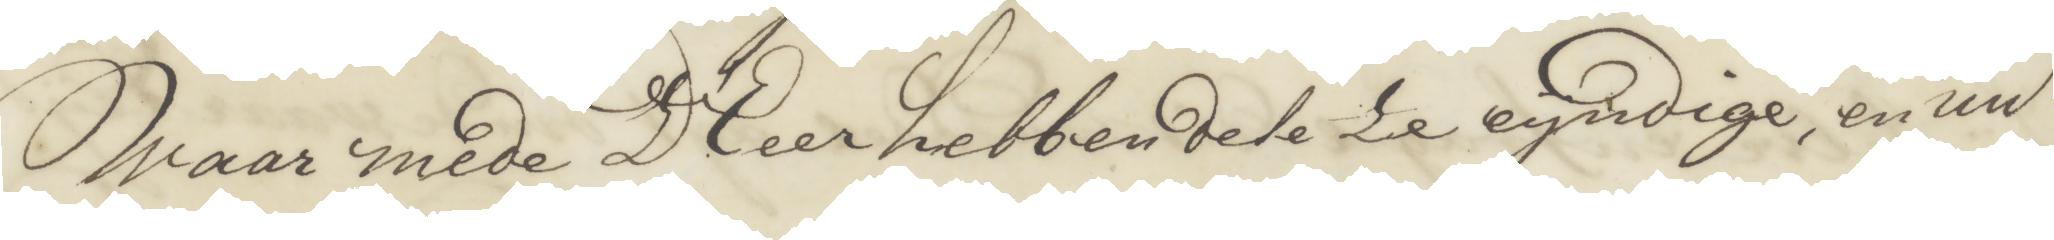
Waar mede D'Eeer hebben dese te eijndige, en uw
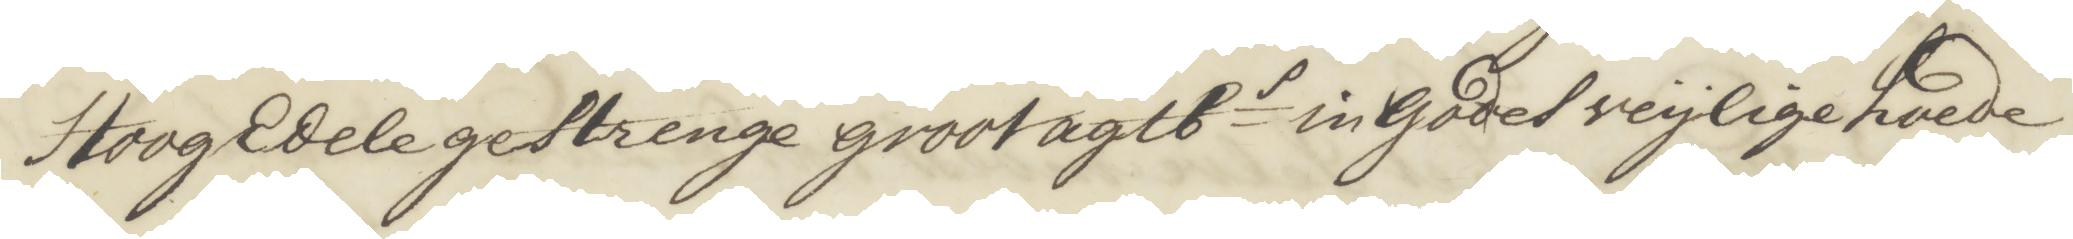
Hoog Edele gestrenge groot agtb=s in Godes veijlige hoede
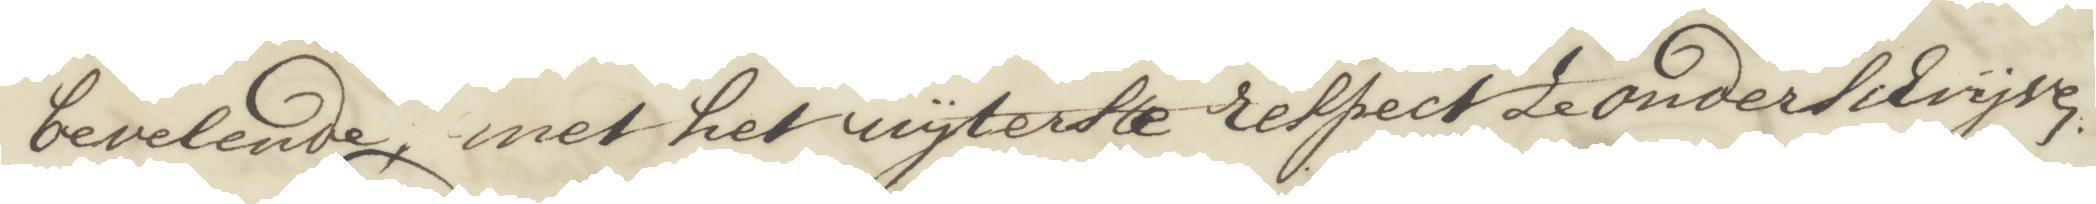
bevelende, met het uijterste respect te onderschrijven:
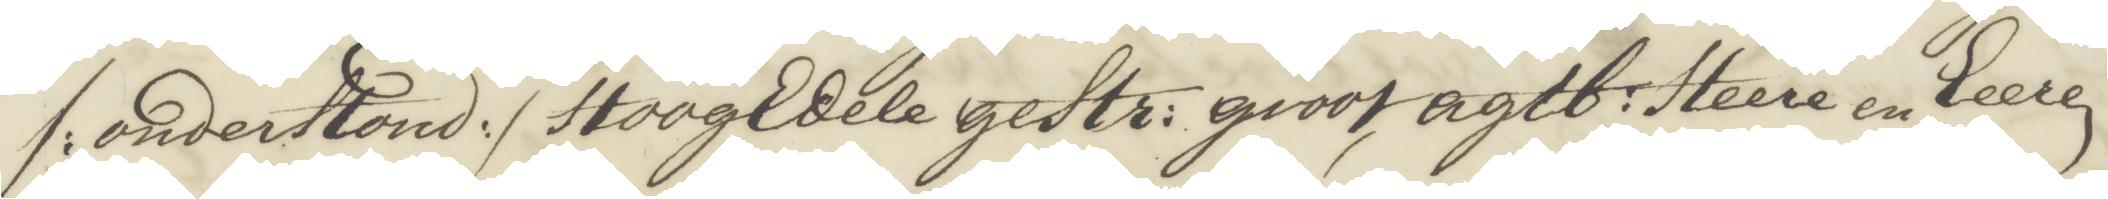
/:onderstond :/ Hoog Edele gestr: groot agtb: Heere en heeren
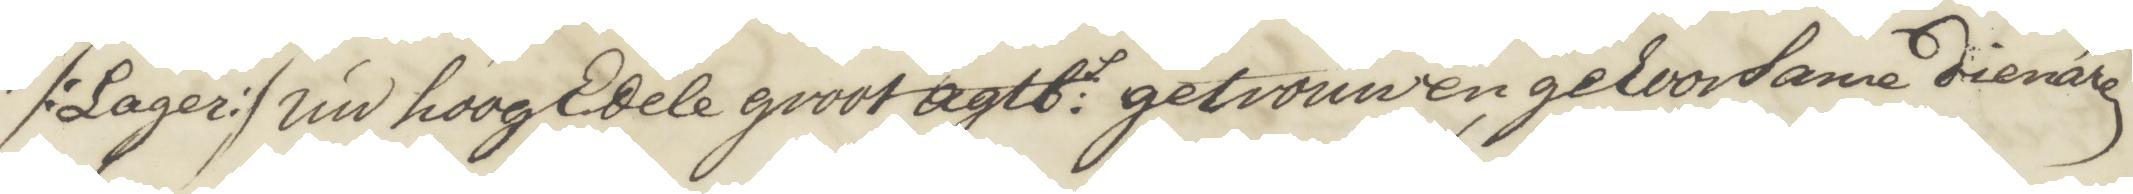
/:Lager:/ uw hoog Edele groot agtb:s getrouwen gehoorsame dienaren
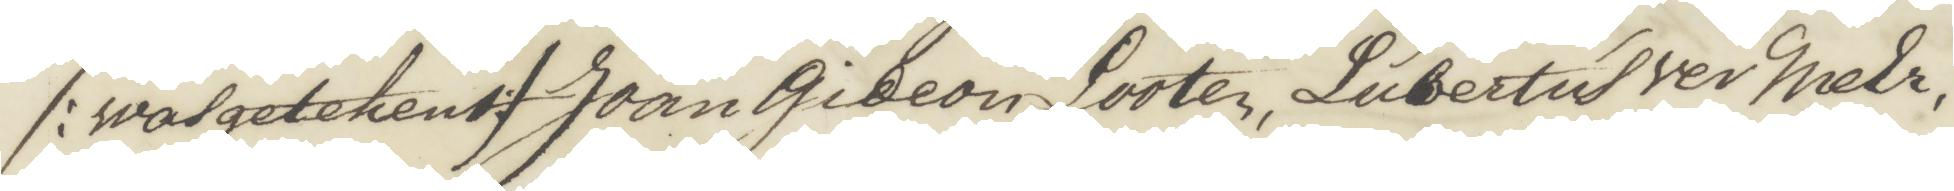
/: was getekent:/ Joan gideon Looten, Lubertus vermehr,
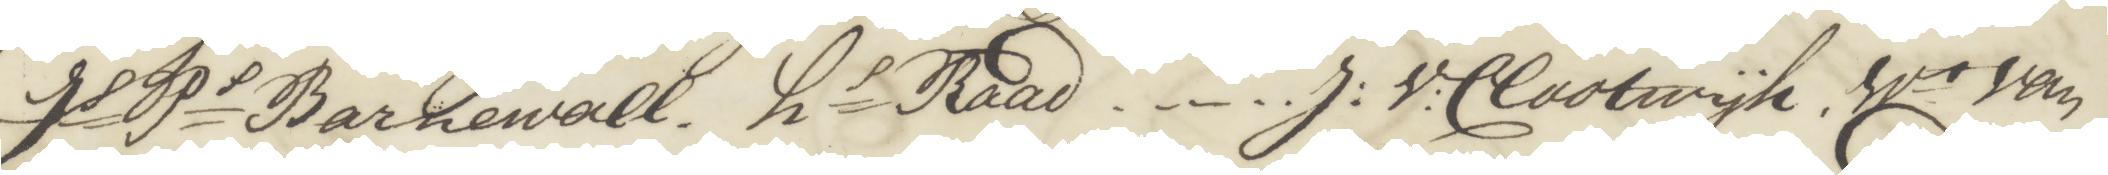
J=s P=s Barnewall. h=s Raad .--.. J: V:Clootwijk, W=t van
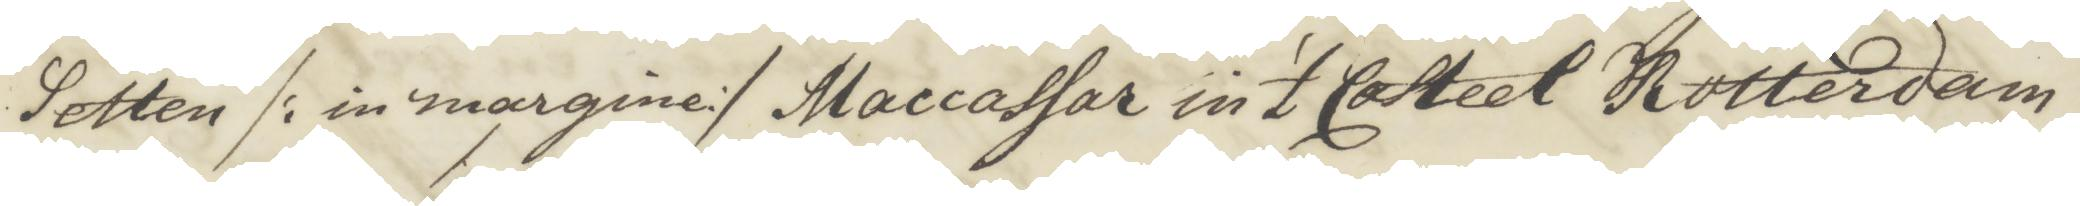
setten /: in margine:/ Maccassar in ’t Casteel Rotterdam
